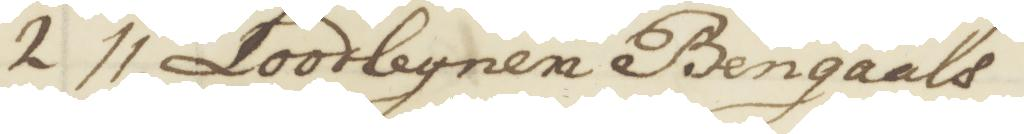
2 „ Loodleynen Bengaals
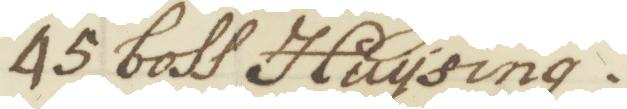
45 boss Huijsing
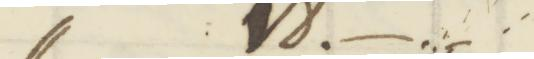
„ 18.—.—
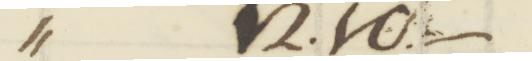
„ 12.10.—
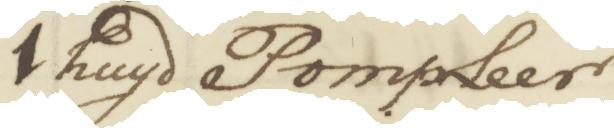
1 huijd Pompleer
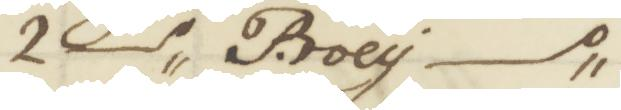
2 d„o Boeij d„o
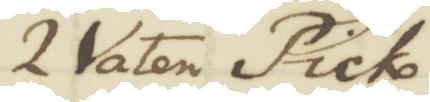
2 Vaten Pick
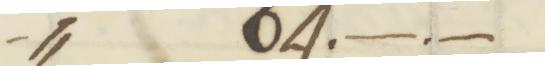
-„ 64.—.—
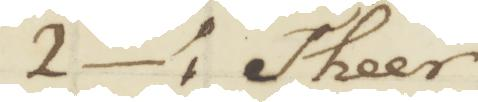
2 d„o Theer
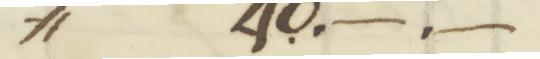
-„ 40.—.—
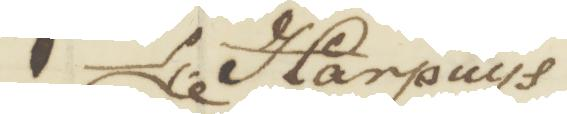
1 d„o Harpuijs
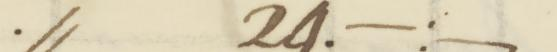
-„ 24.—:—
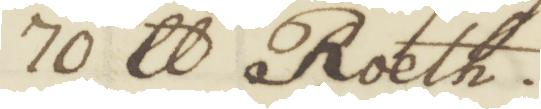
70 lb: Roeth
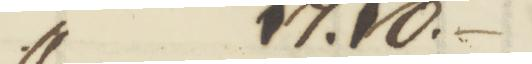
-„ 17.10.—
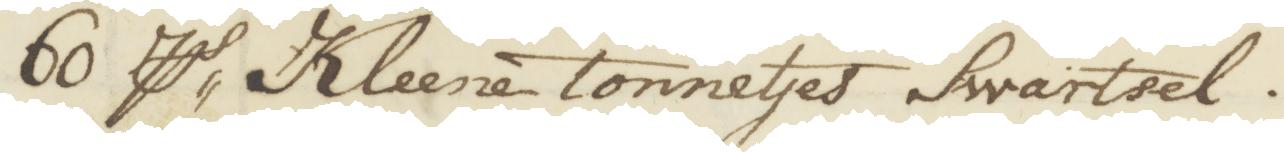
60 P„s Kleene tonnetjes swartsel.
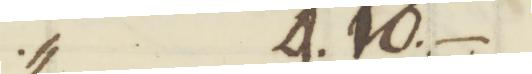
-„ 4.10.—
